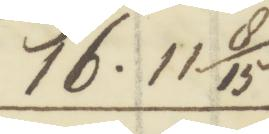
16. 11 8/15
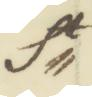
S„t
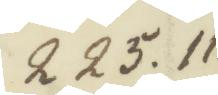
225.11
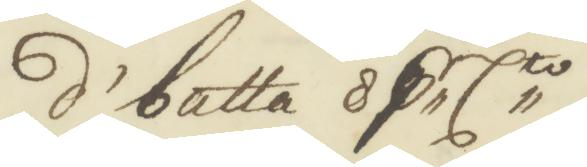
d’ batta 8 p„r C„to
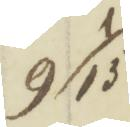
9 1/15
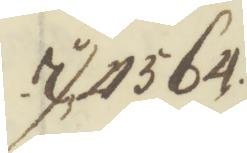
r:o/, 4564.
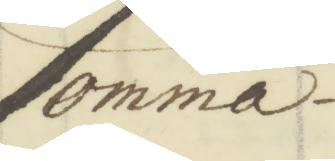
Somma.
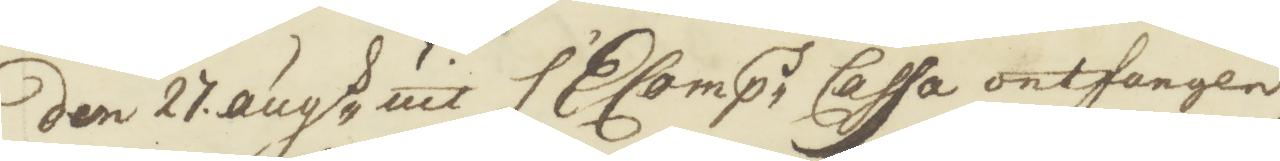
den 27. aug„s uit ’S E Comp„s Cassa ontfangen
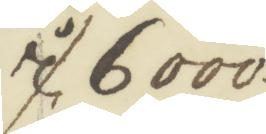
r:o/, 6000
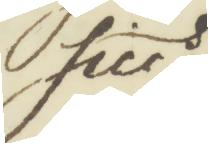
Sicc:s
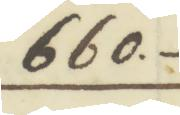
660.-
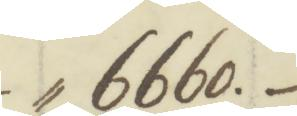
„ 6660.-
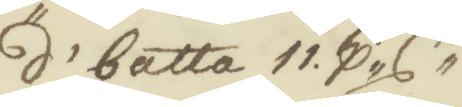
d’ batta 11. p„r C„to
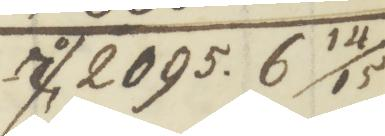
r:o/, 2095. 6 14/15
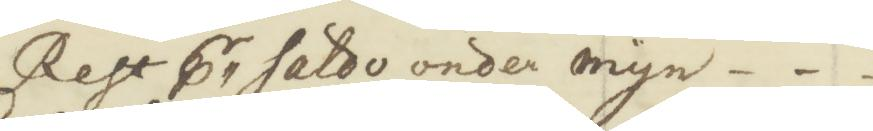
Rest p„r saldo onder mijn - - -
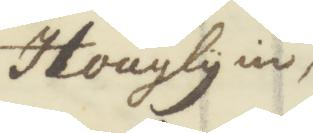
Houglij in,
